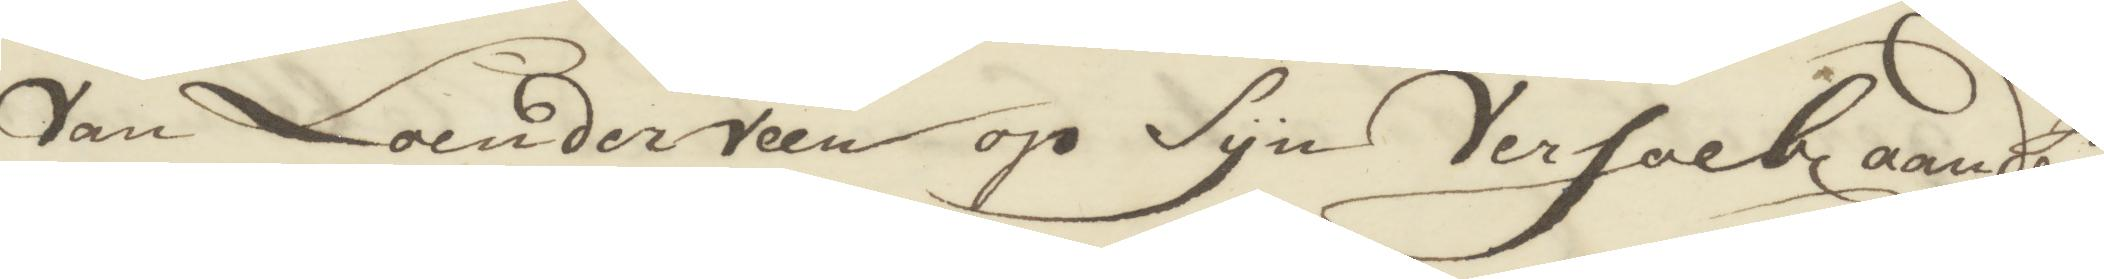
van Loenderveen op Sijn versoek aan de
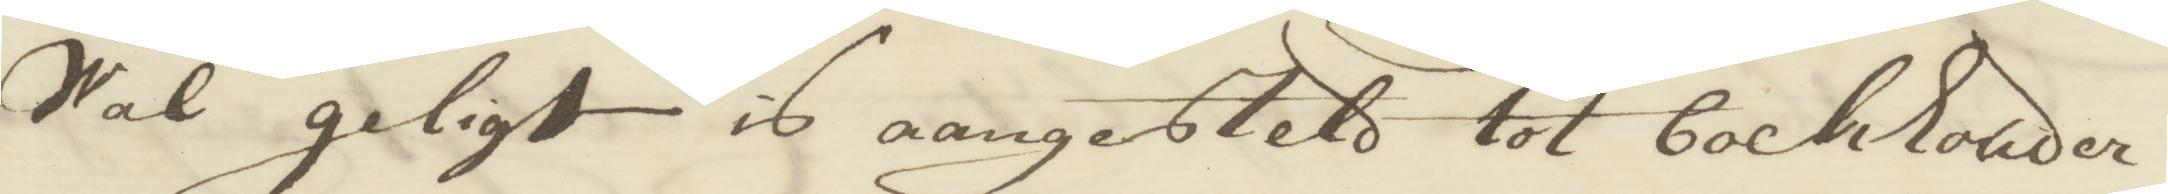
wal geligt is aangesteld tot boekhouder
